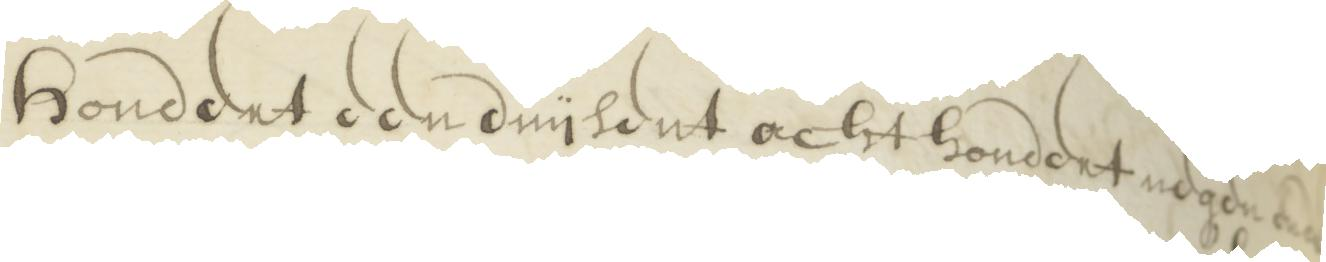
hondert een duijsent acht hondert negen
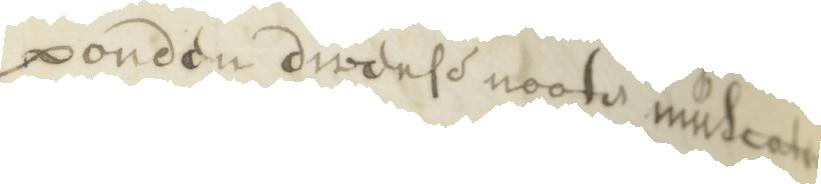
ponden diverse noote muscat
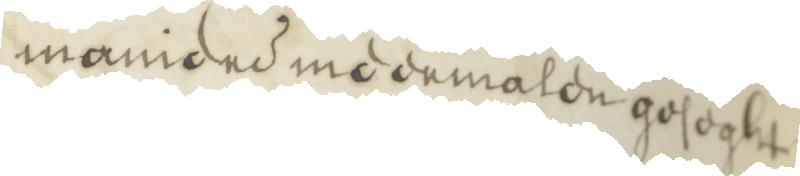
maniers meermalen geseght
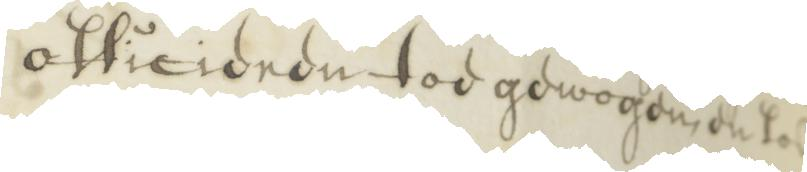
officieren toe gewogen, en lo
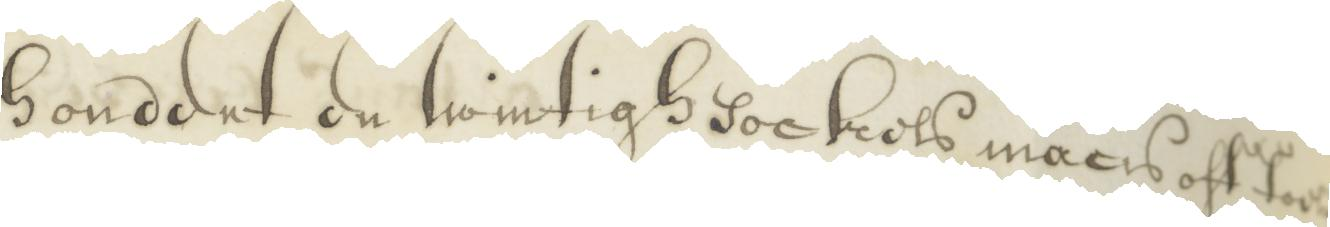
hondert en twintigh sockels macis off toel
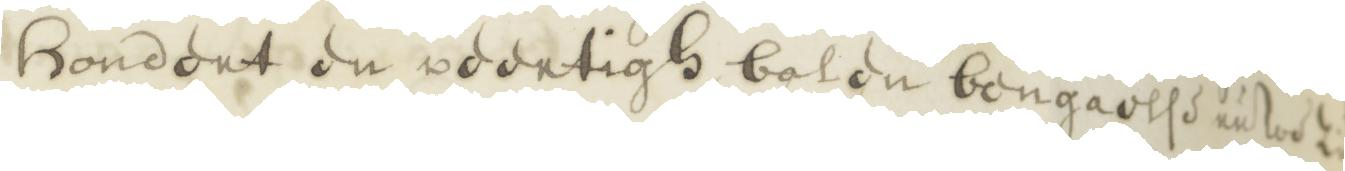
hondert en veertigh balen bengaelse ruwe
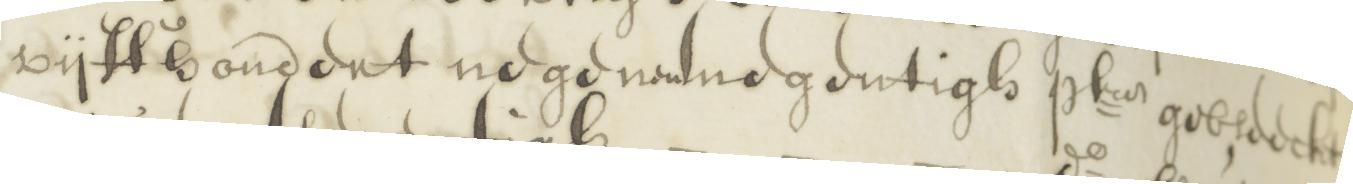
vijff hondert negenennegentigh p=ke gebleeckt
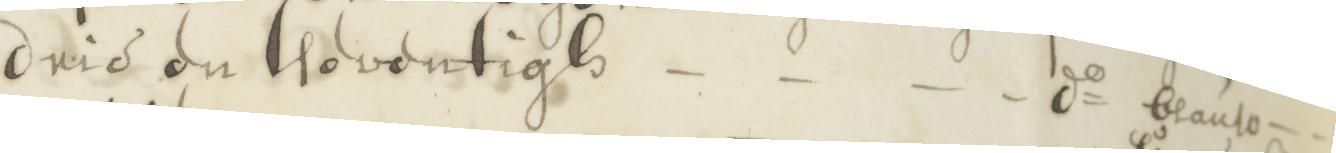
drie en tseventigh - - - - d=o blauw-
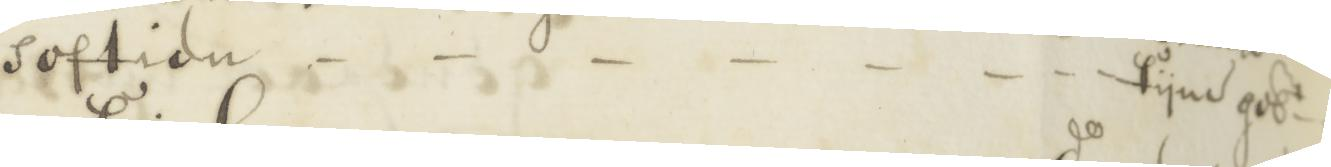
seftien - - - - - - - tijne ged=t
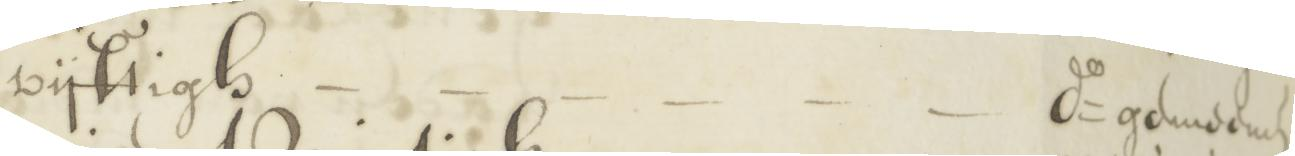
vijftigh - - - - - - d=o gemeene
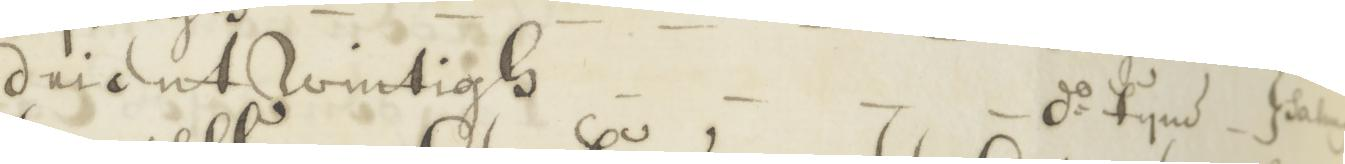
drient wintigh - - - - d=o fijne sal
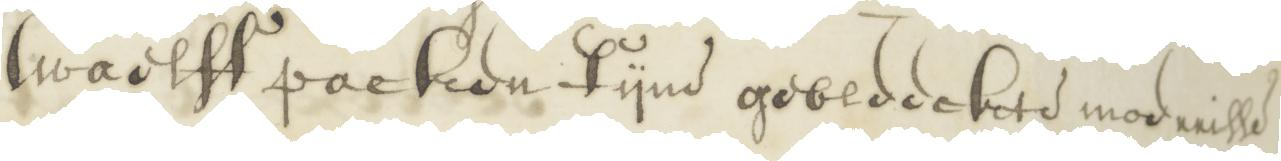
twaelff packen tijne gebleeckte moerrisse
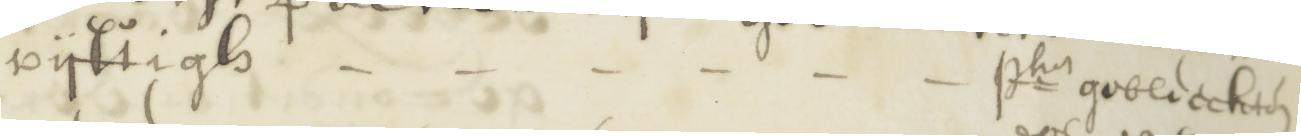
vijftigh - - - - - - p=he gobleeckten
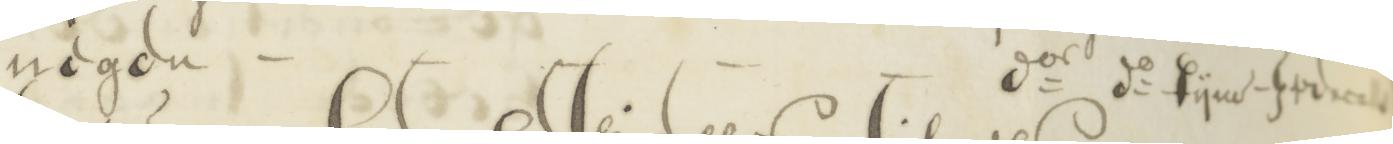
negen - - - - - d=o d=o fijne per
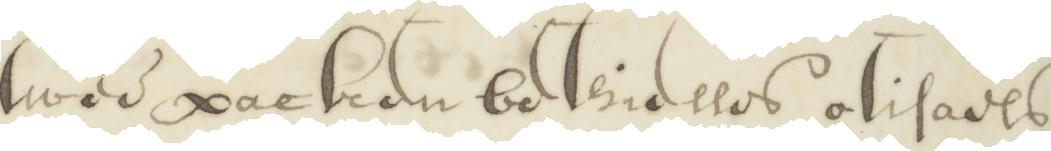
twee packen bethielles otisaels
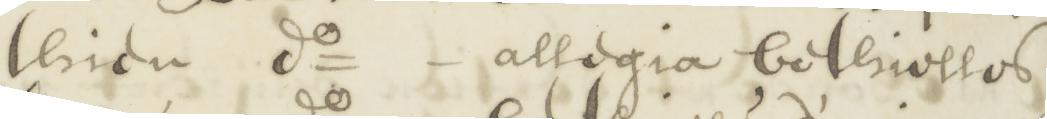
thien d=o - allegia bethielles
